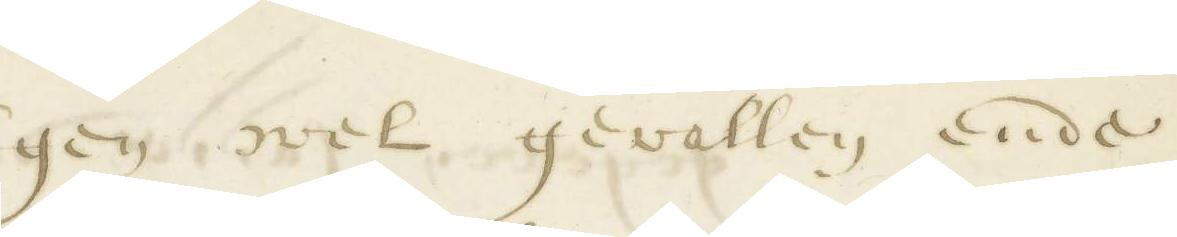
naer sijn eijgen wel gevallen ende
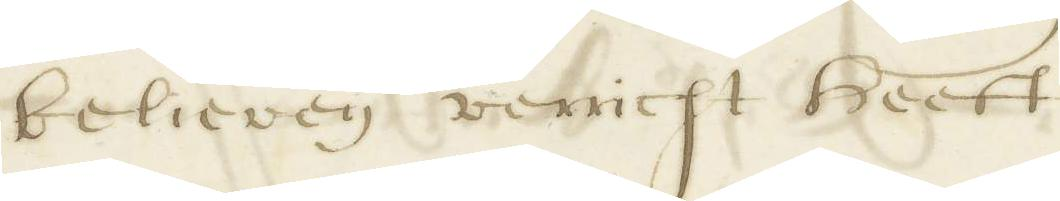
believen verricht heeft
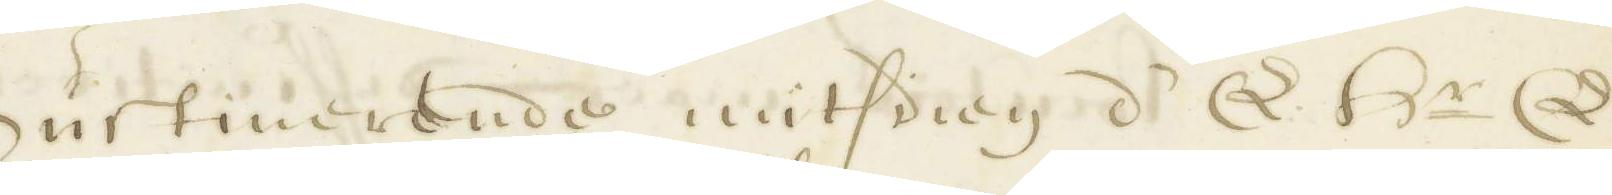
Sustinerende mitsdiend’ E: Eij=r
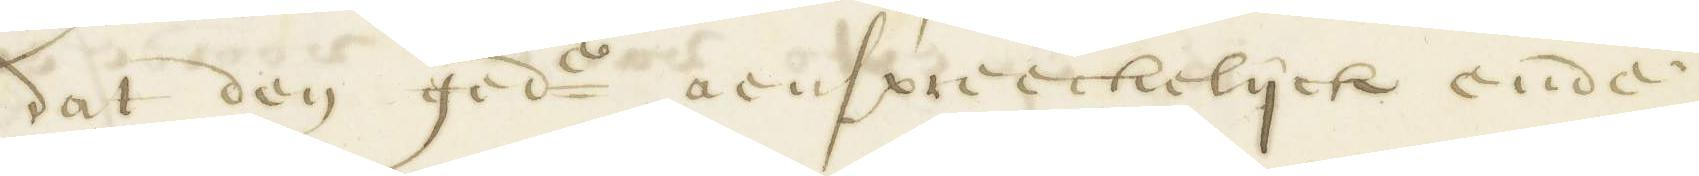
dat den ged=e aenspreeckelijck ende
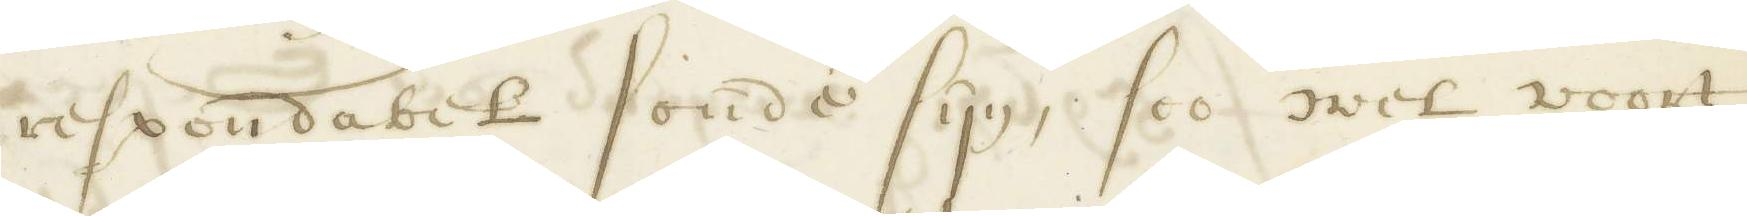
respondabel soude sijn, soo wel voort
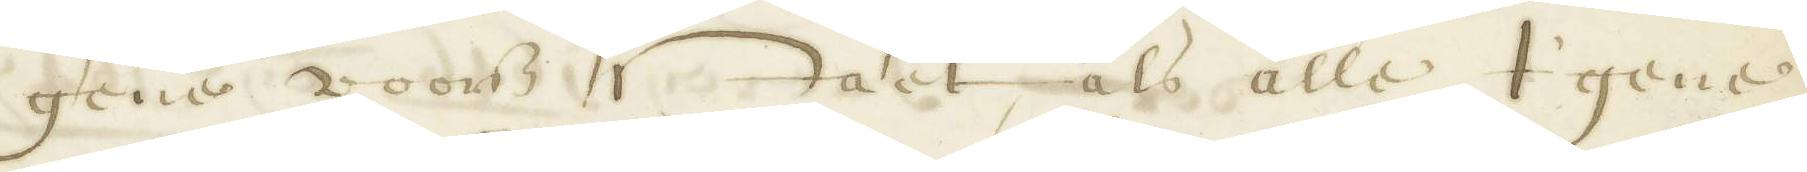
gene voorsz staet, als alle t'gene
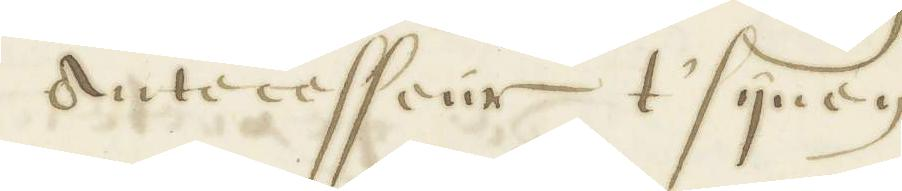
Antecesseur t'sijnen
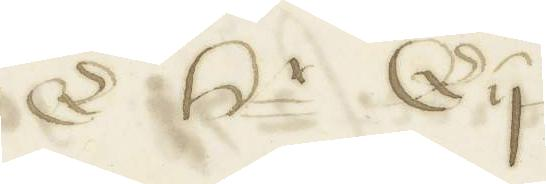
E H=r Eij
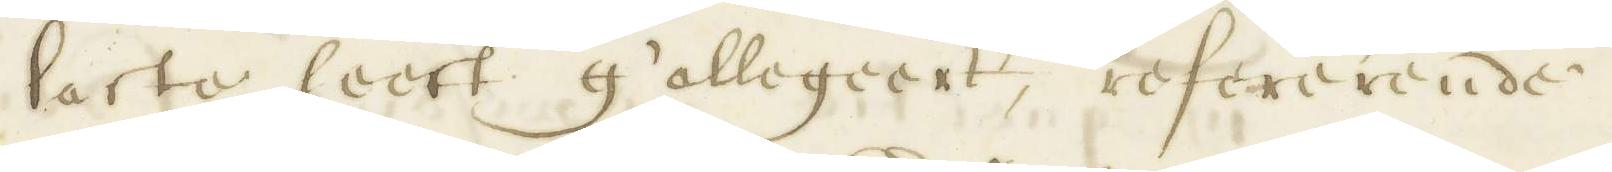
laste heeft g’allegeert, refererende
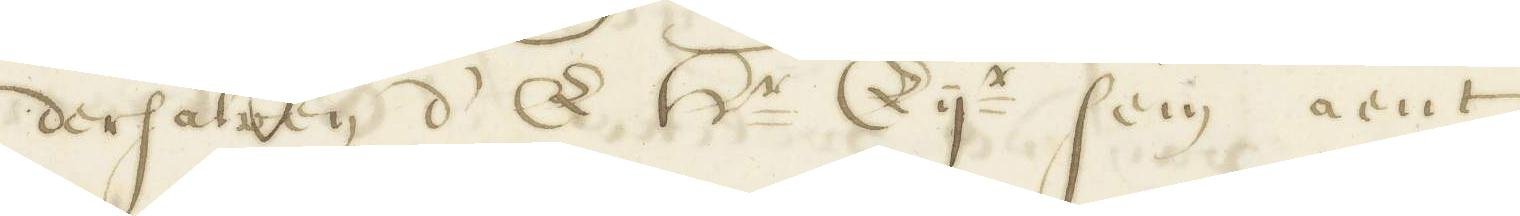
dersalven d’ E H=r Eij=r hem aent
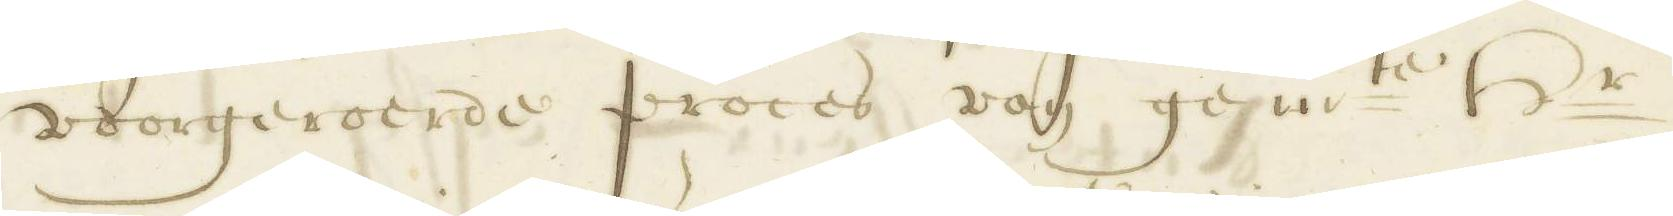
voorgevoerde proces van gem=te H=r
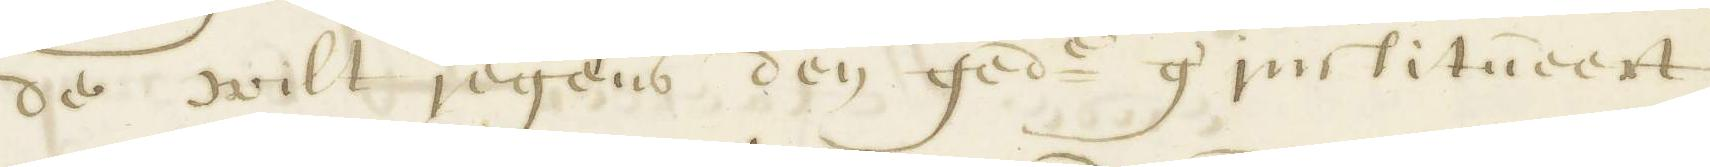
de wilt jegens den ged=e g’institueert
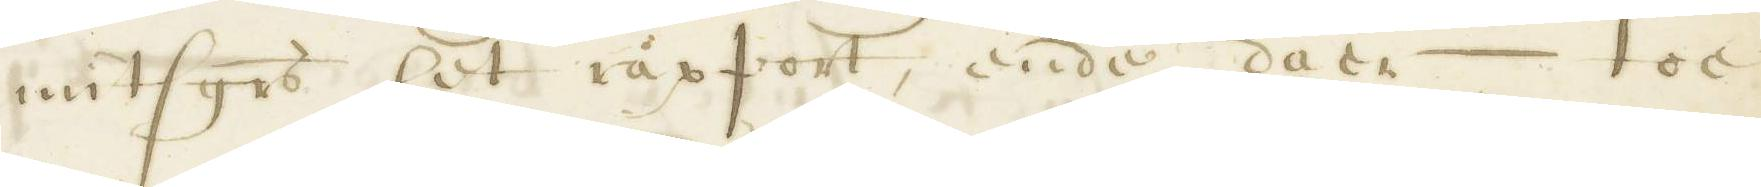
mitsgrs het rapport, ende daer — toe
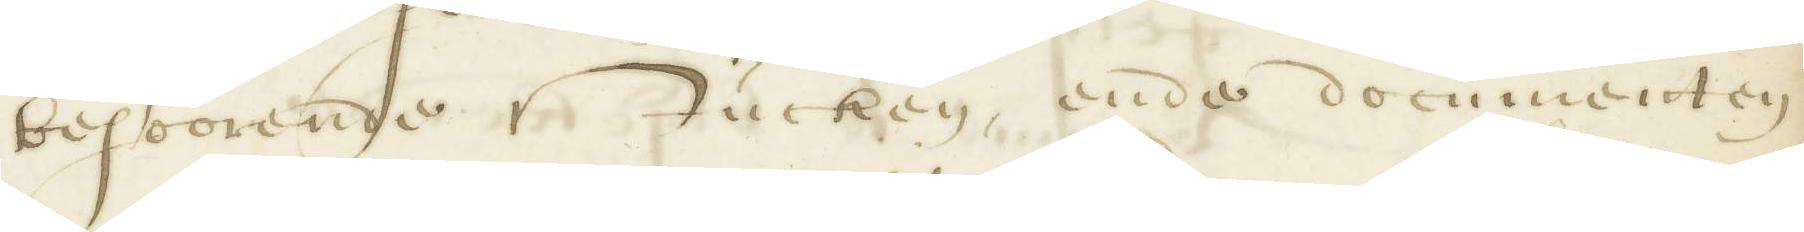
behoorende stucken, ende documenten
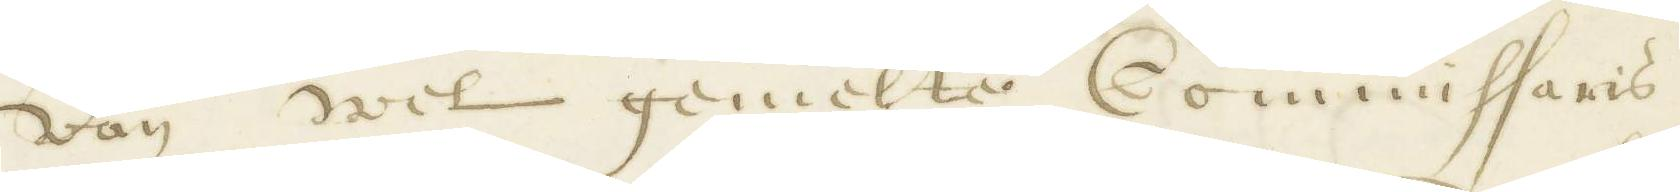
van wel gemelte Commissaris
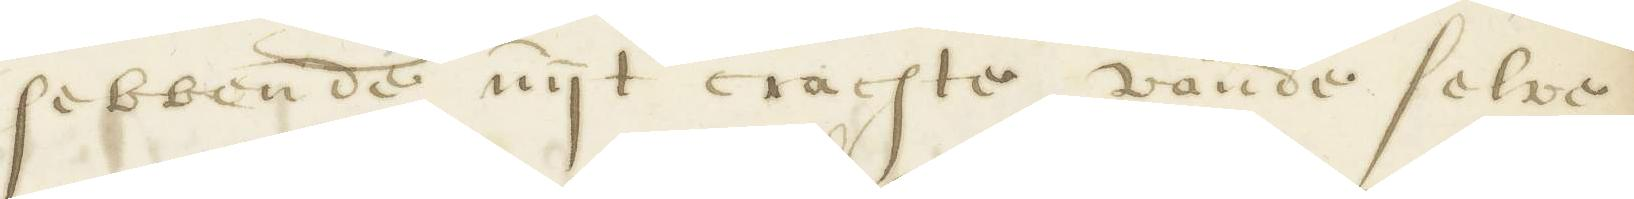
hebbende uijt crachte van de selve
